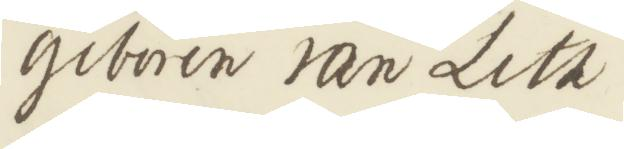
geboren van Lith
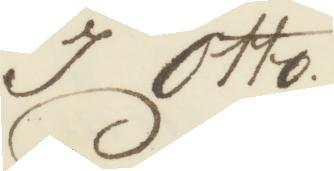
I Otto
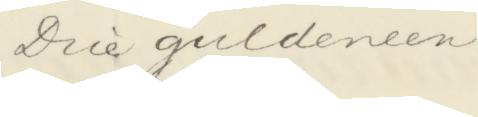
Drie gulden een
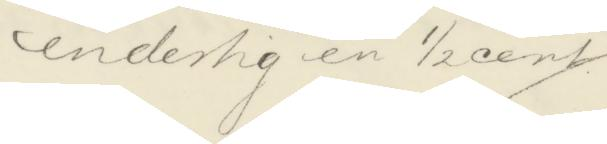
en dertig en ½ cent
